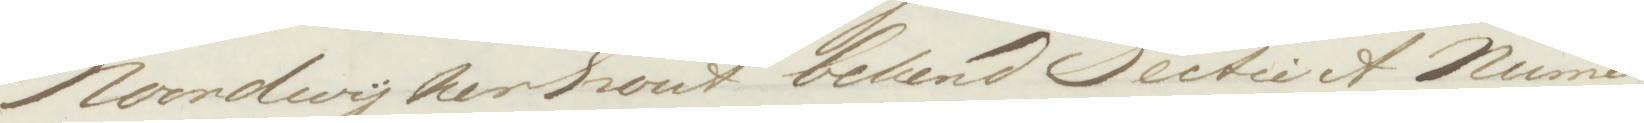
Noordwijkerhout bekend Sectie A Nume
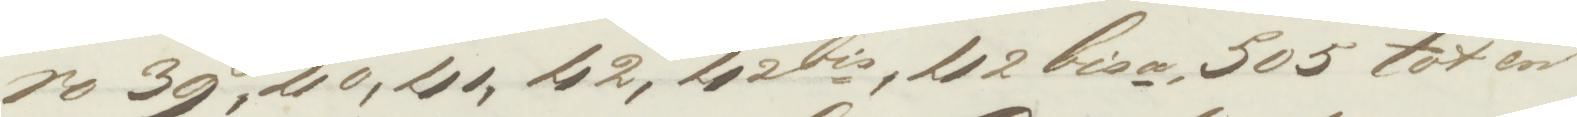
ro 39, 40, 41, 42, 42=bis, 42 bis-a, 505 tot en
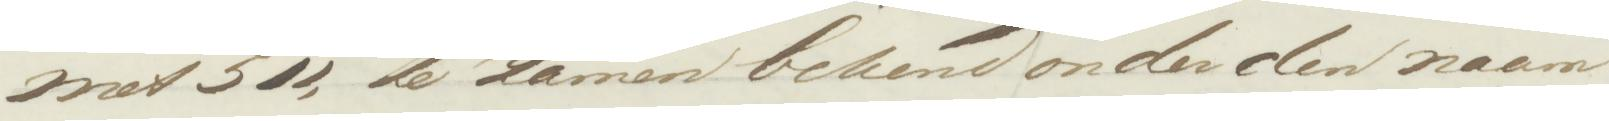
met 511, te zamen bekend onder den naam
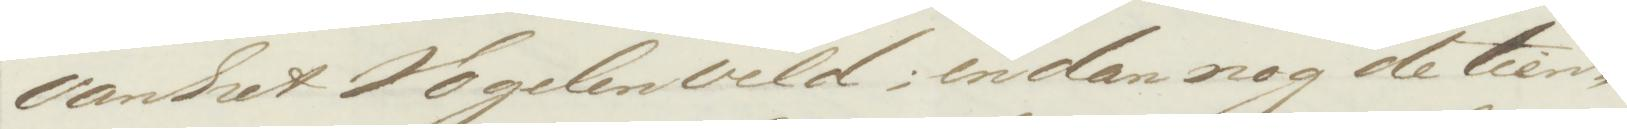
van het Vogelen veld; en dan nog de tien„
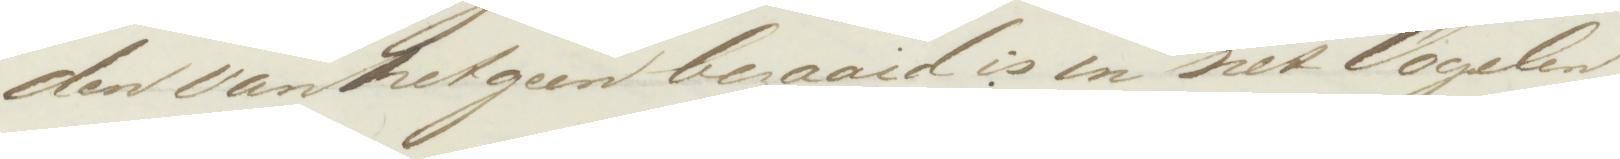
den van hetgeen bezaaid is in het Vogelen
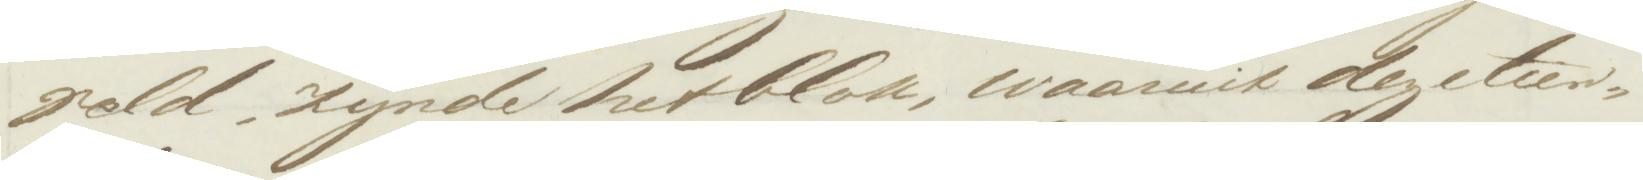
veld, zynde het blok, waaruit deze tien„
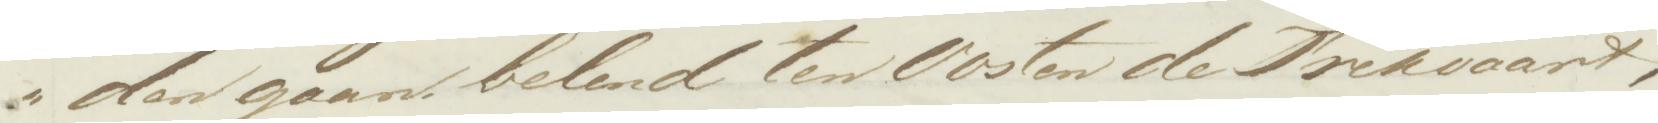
„den gaan, belend ten Oosten de Trekvaart,
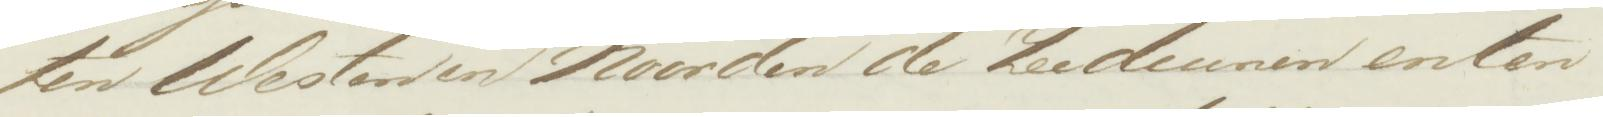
ten westen en Noorden de Zeedeuren en ten
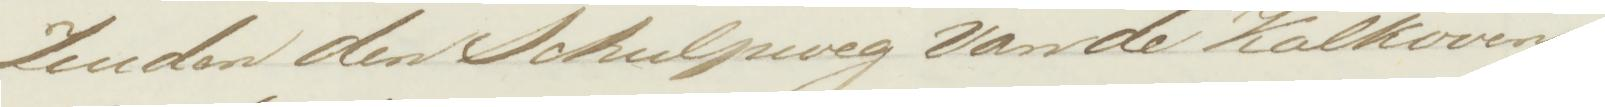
Zuiden den Schulpweg van de Kalkovens
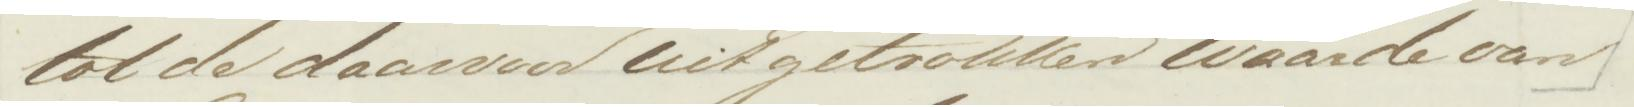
tot de daarvoor uitgetrokken waarde van
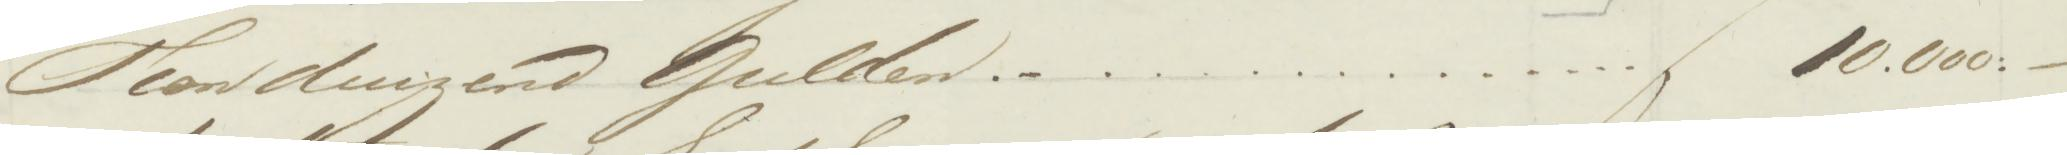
Tien duizend Gulden. - . . . . . . . . . . . . . ƒ 10.000: —
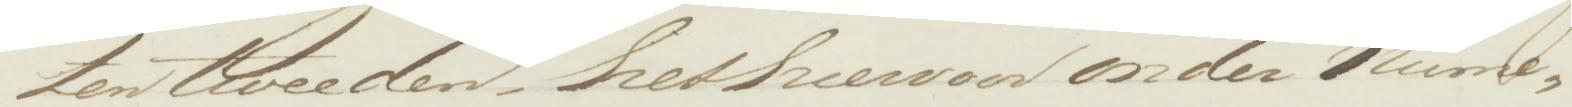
ten tweeden, het hiervoor onder Nume„
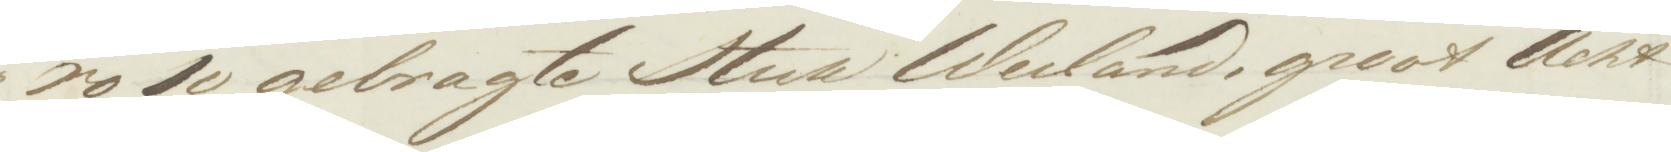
ro 10 gebragte Stuk Weiland, groot Acht
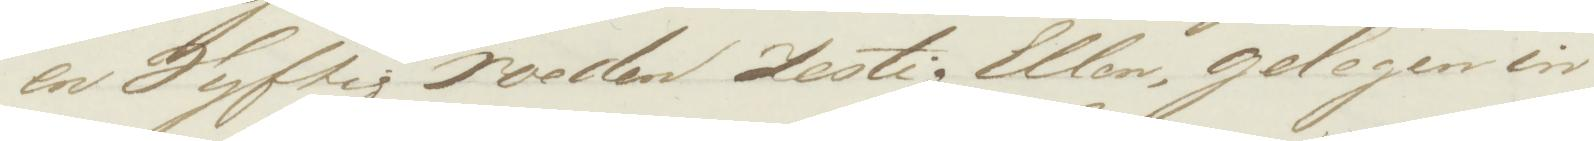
en Vyftig roeden Zestig Ellen, gelegen in
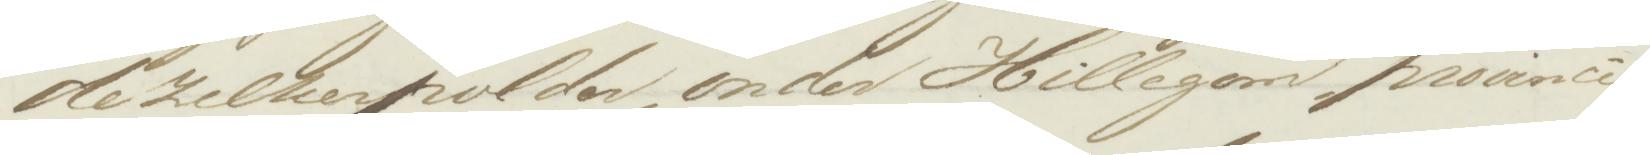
de zilkerpolder, onder Hillegom provincie
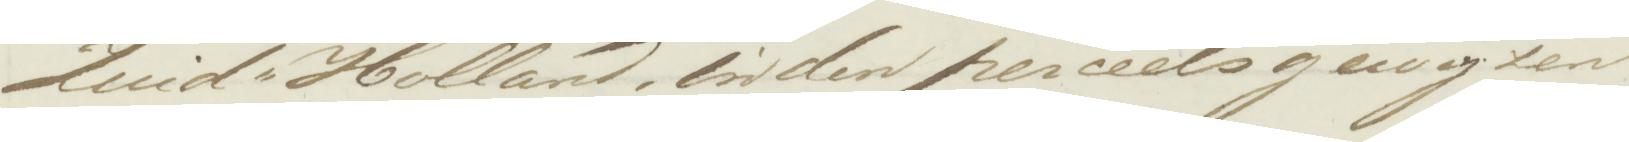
Zuid " Holland, in den perceels gewyzen
